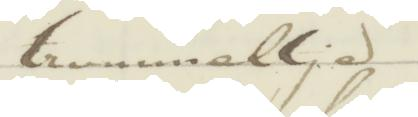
trommeltje
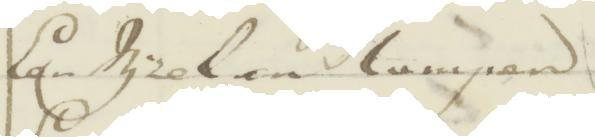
Een Vijzel en stamper
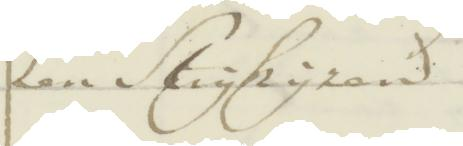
Een Strijkijzen
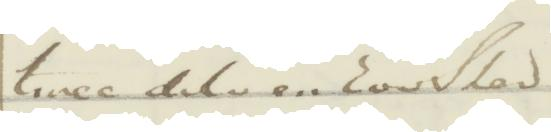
twee dito en Een ster
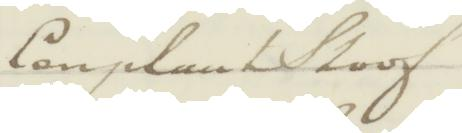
Een plaatstoof
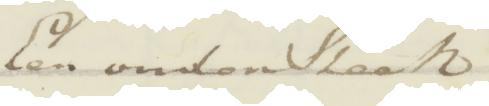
Een ondersteek
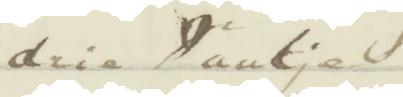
drie Vaatjes
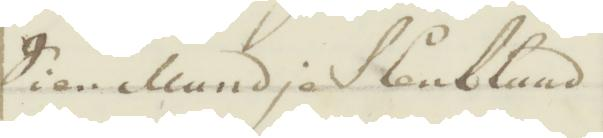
Vier Mandjes Eenblaad
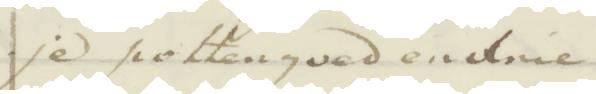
je pottengoed en drie
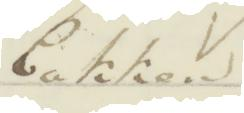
bakken
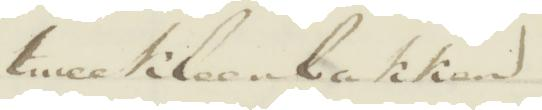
twee kleerbakken
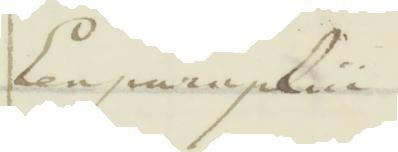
Een paraplui
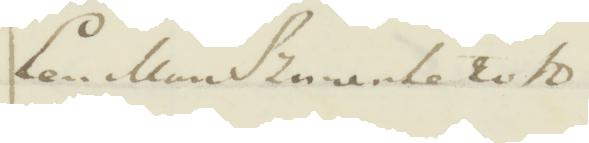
Een Mans zwarte rok
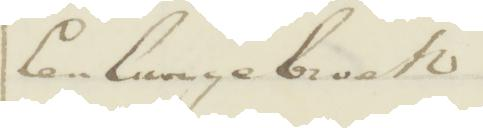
Een lange broek
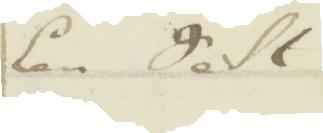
Een Vest
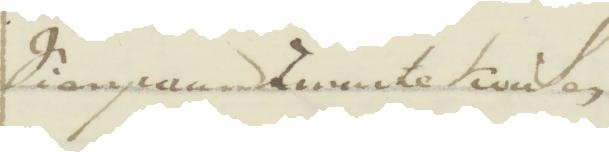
Vier paar Zwarte kousen
